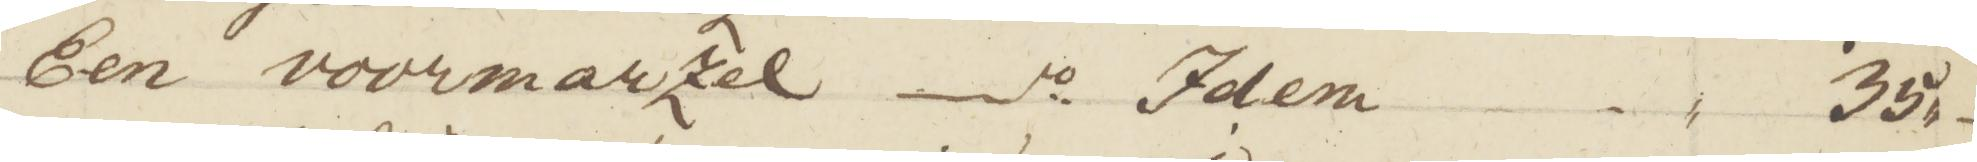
Een voormarzel — _=o Idem - - „ 35„
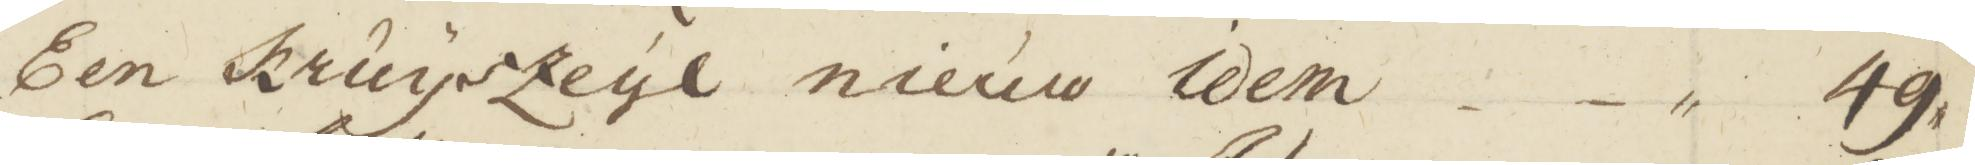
Een kruijszeijl nieuw idem - - „ 49„
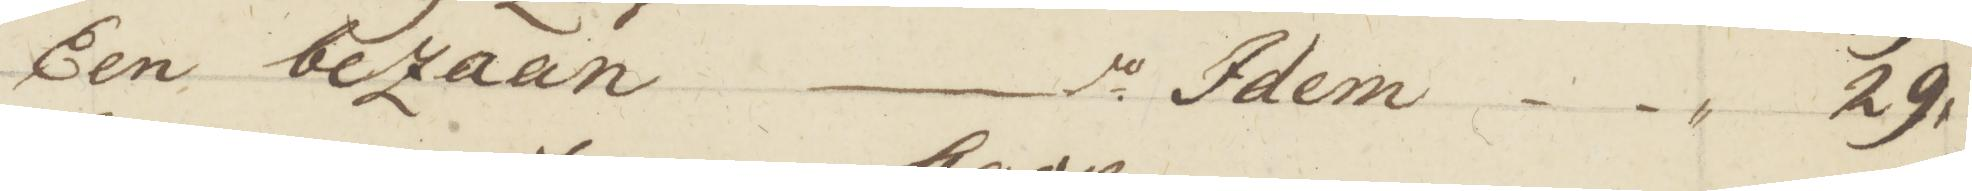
Een bezaan —_=o Idem - - „ 29„
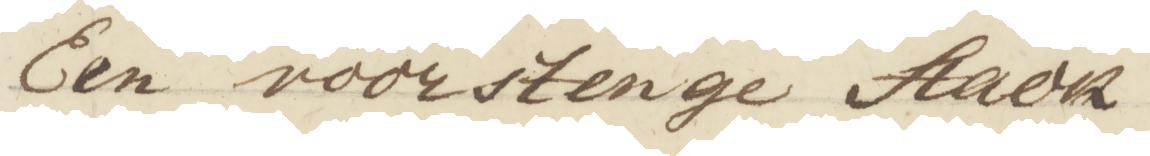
Een voorstenge staek
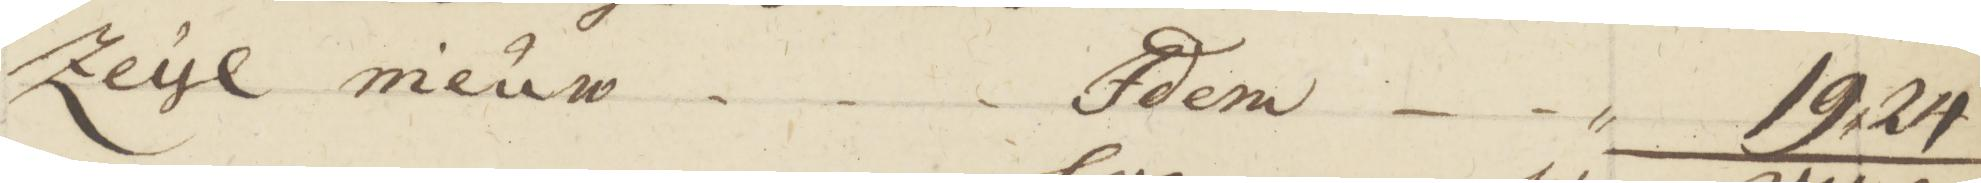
Zeijl nieuw - - - Idem - - „ 19„24
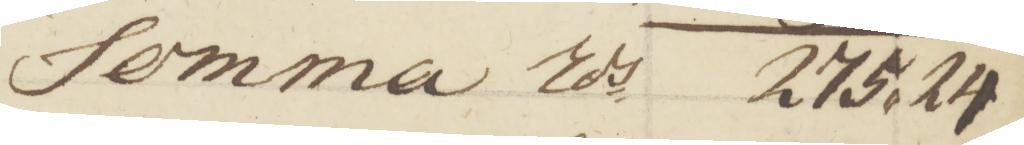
Somma rd=s 275„24
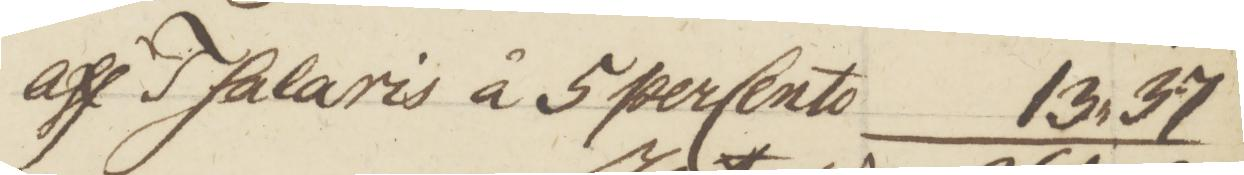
aff 'T salaris â 5 percento 13„37
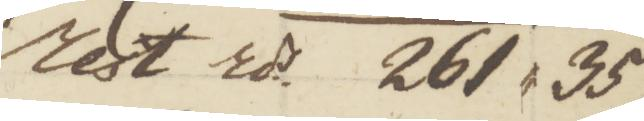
rest rd=s 261„35
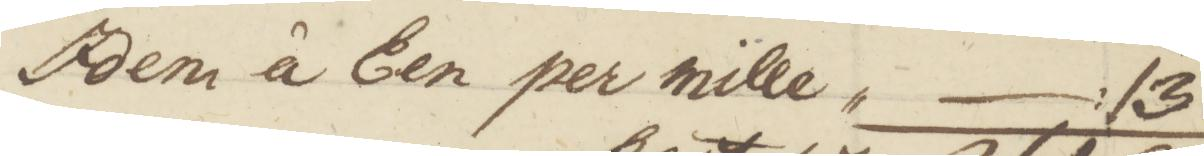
Idem a Een per mille „ —:13
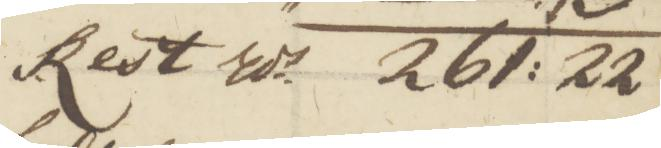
Rest rd=s 261: 22
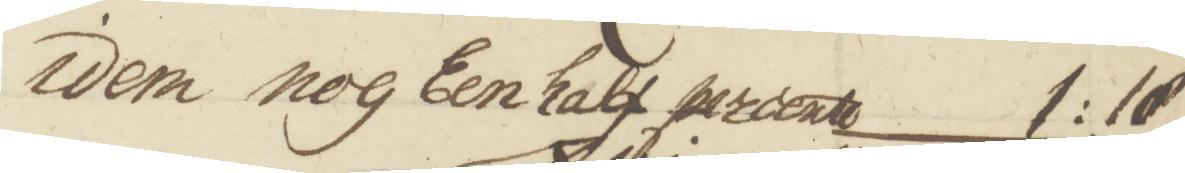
idem nog Een half percento 1:18
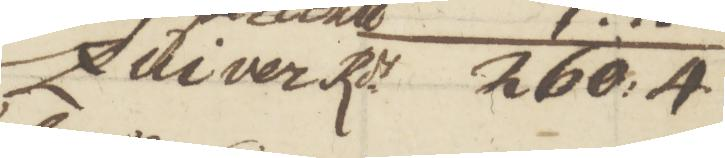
Zuiver Rd=s 260:4
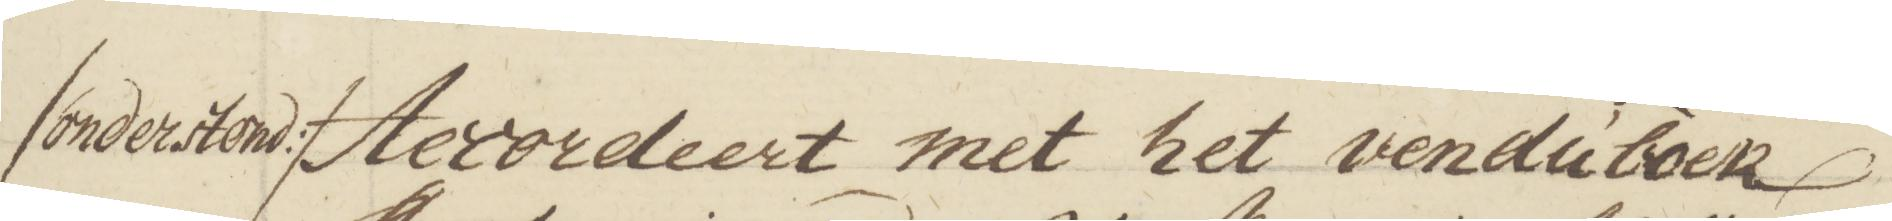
/onderstond:/ Aecordeert met het venduboek
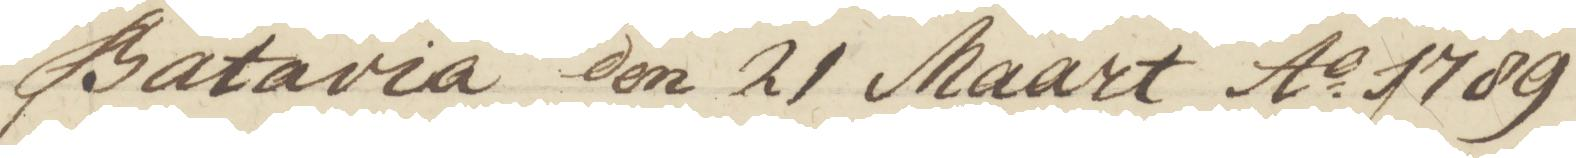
Batavia den 21 Maart A=o 1789
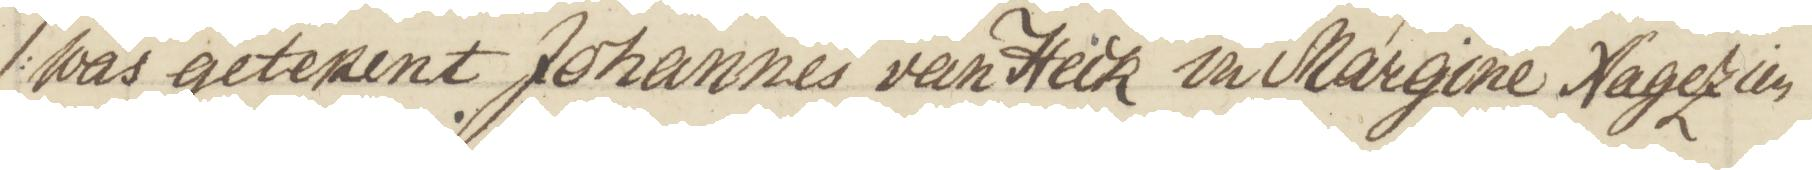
/:was getekent Jonannes van Heck in Margine Nagezien
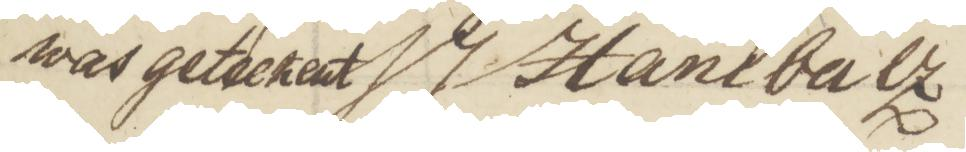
was geteekent J J Hanibalz
